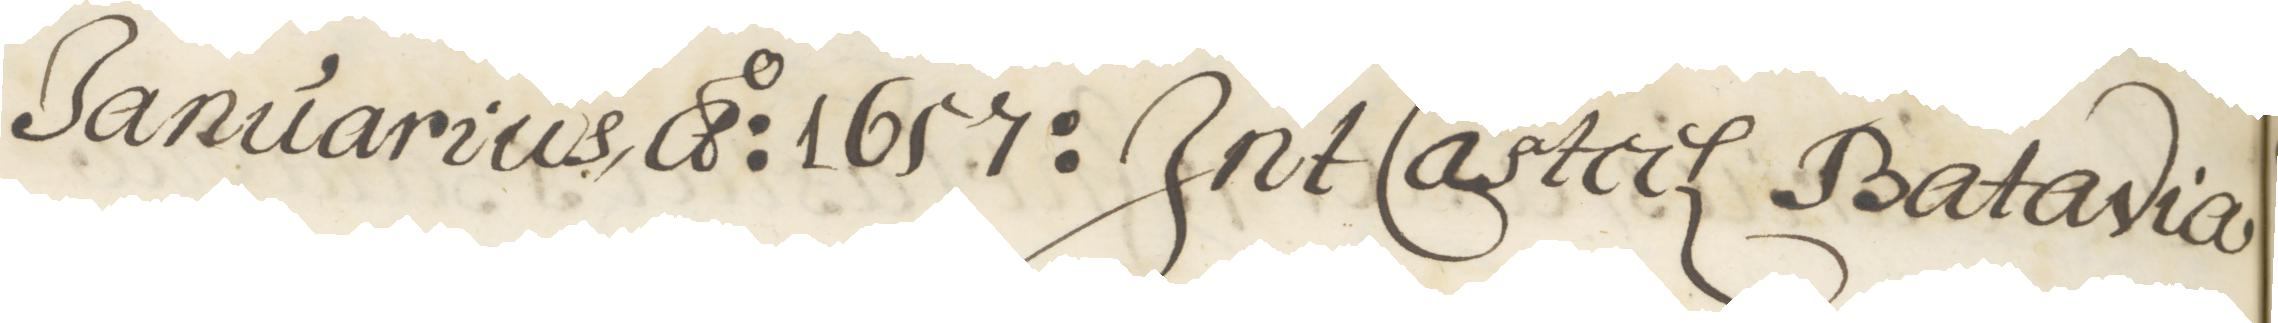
Ianuarius, a:o 1657: In 't Casteel Batavia
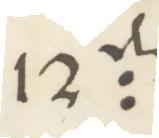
12:en
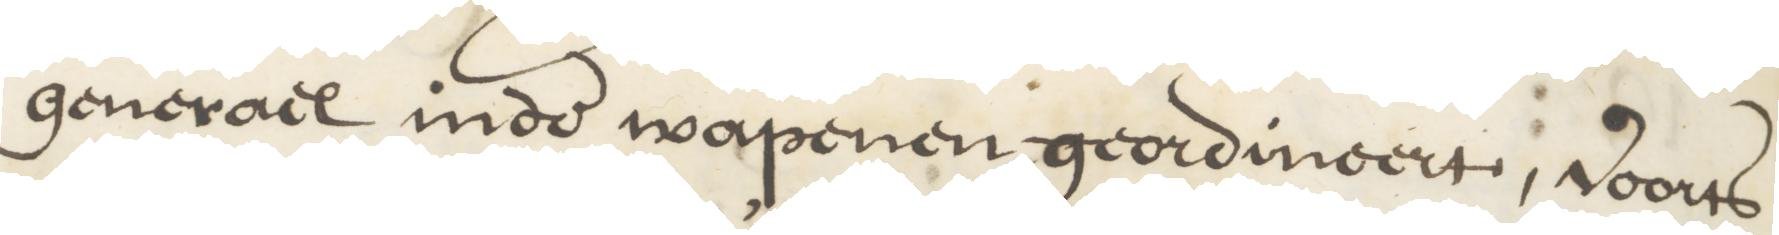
generael inde wapenen geordineert, voorts
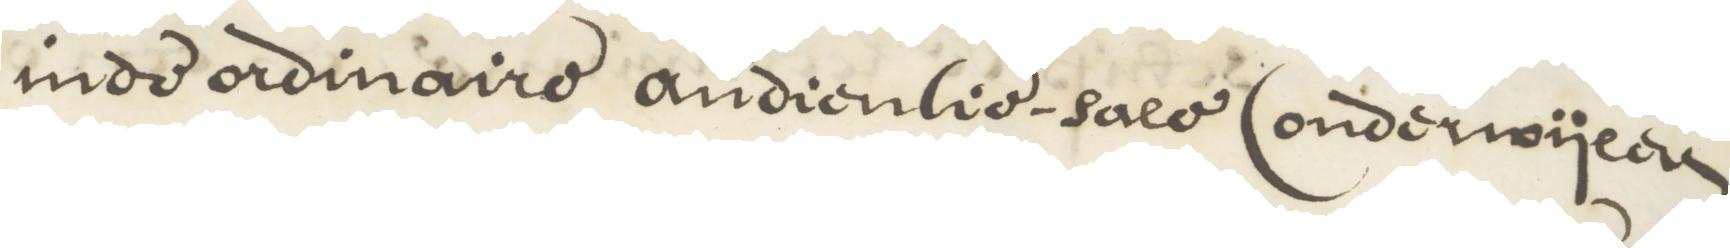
inde ordinaire audientie-sale (onderwijlen
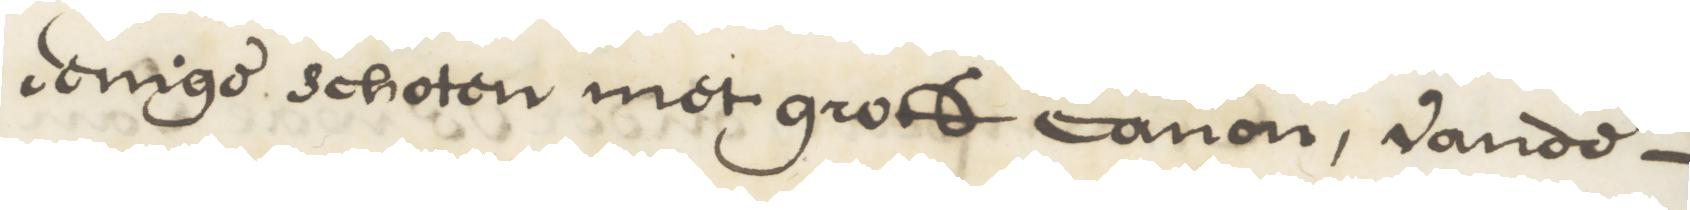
eenige schoten met groff canon, vande
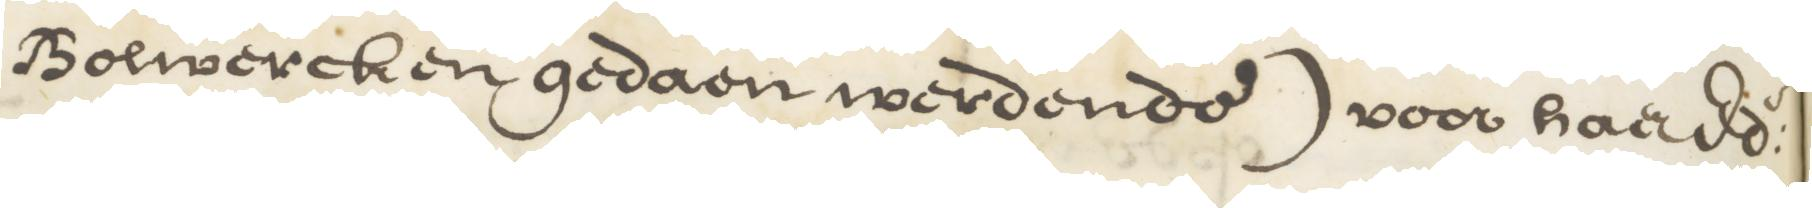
Bolwercken gedaen werdende) voor haer Ed:e
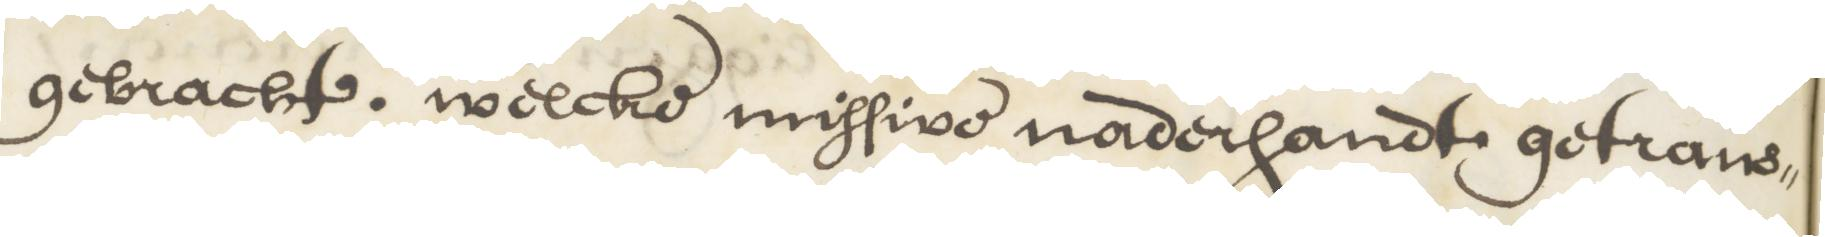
gebracht. welcke missive naderhandt getrans„
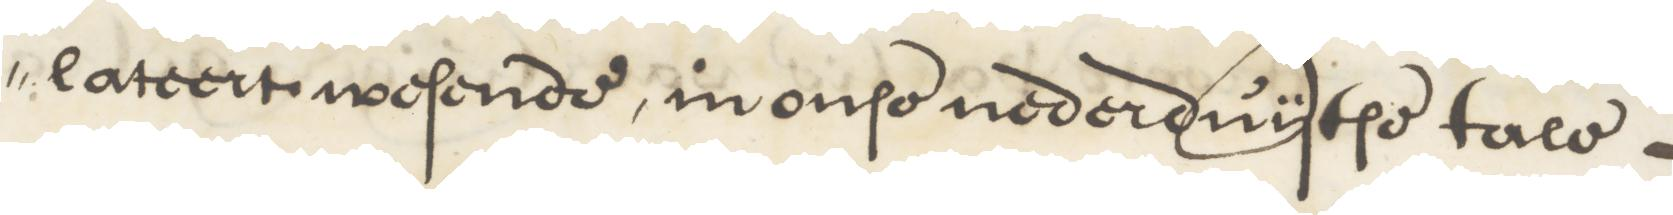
„lateert wesende, in onse nederduijtse tale
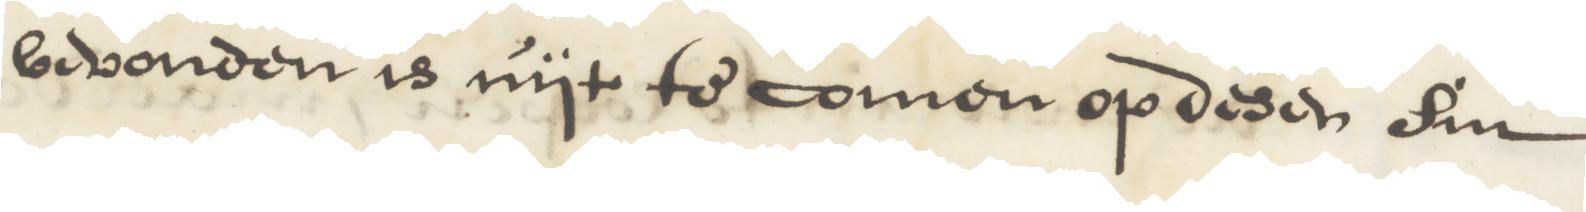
bevonden is uijt te comen op desen sin
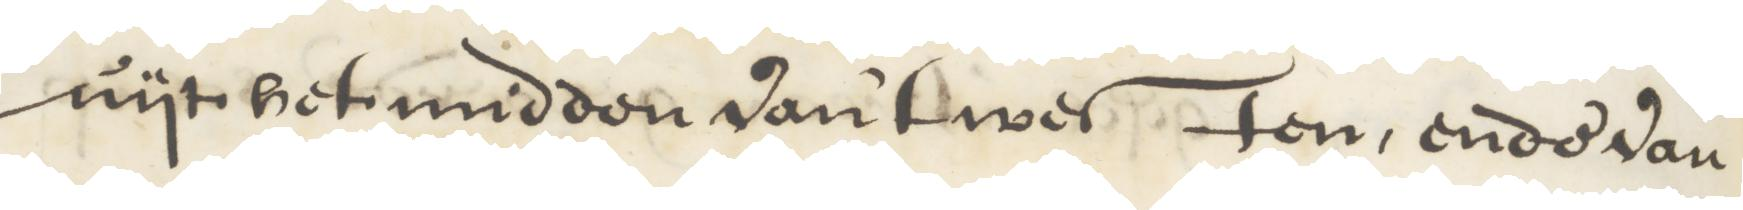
uijt het midden van ’t westen, ende van
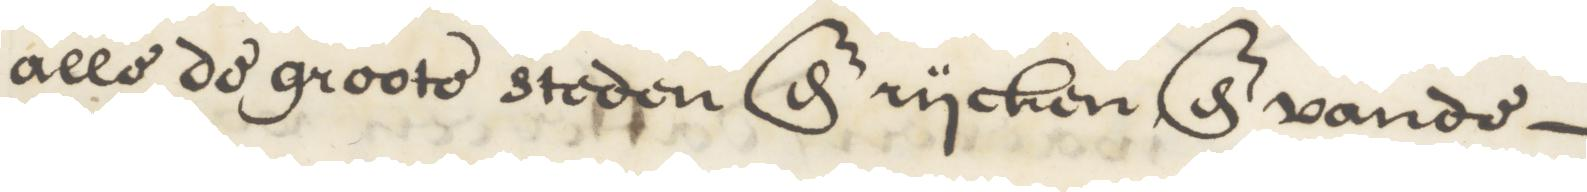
alle de groote steden ende rijcken ende vande
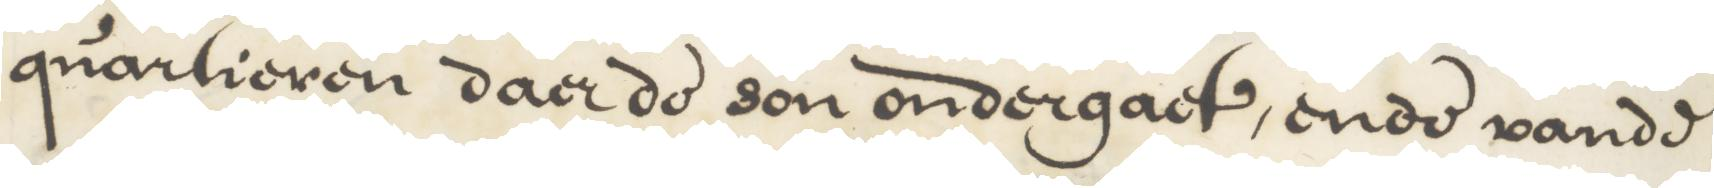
quartieren daer de son ondergaet, ende vande
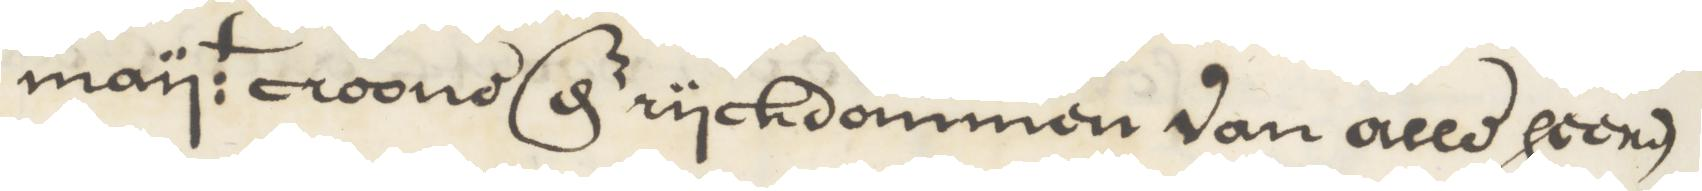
maij:t croone ende rijckdommen van alle heeren
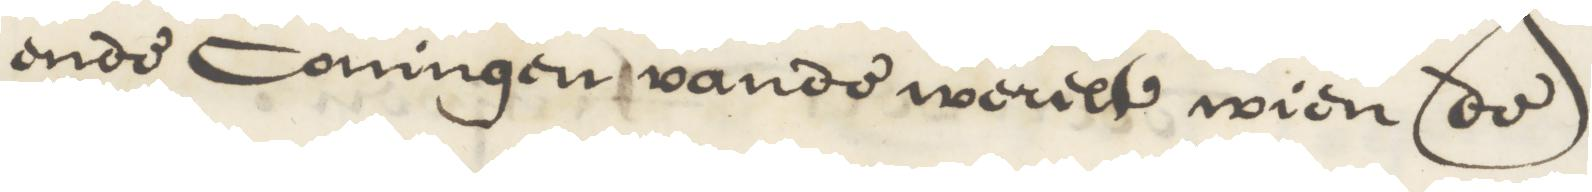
ende Coningen vande werelt wien de
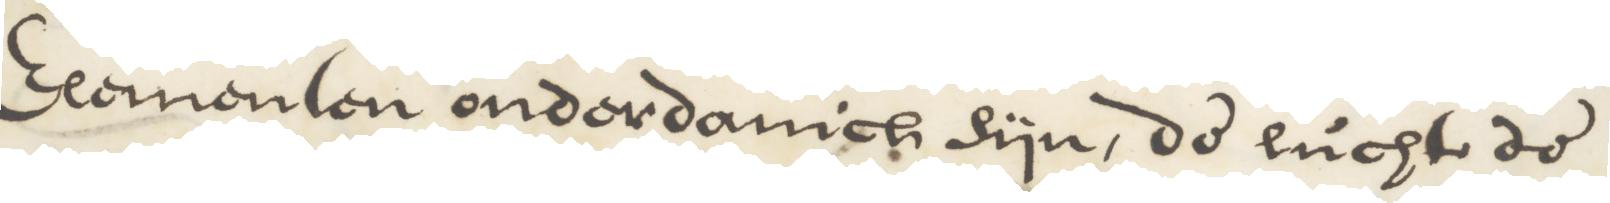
Elementen onderdanich sijn, de lucht de
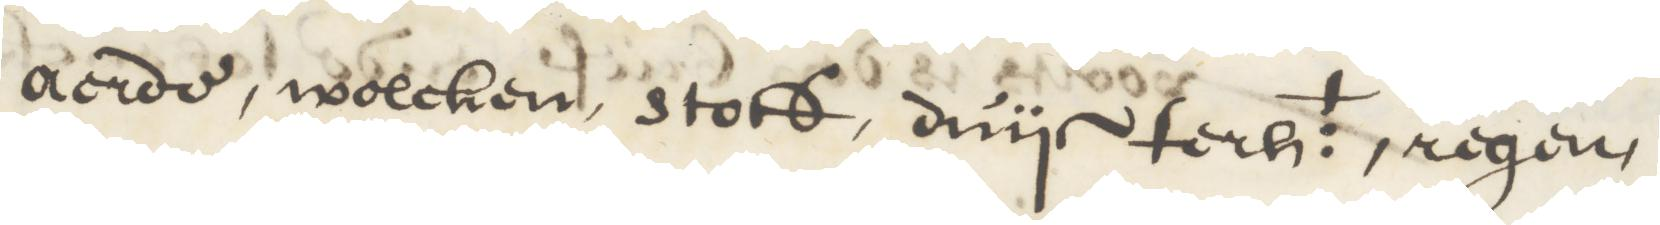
aerde, welcken, stoff, duijsterh:t, regen,
